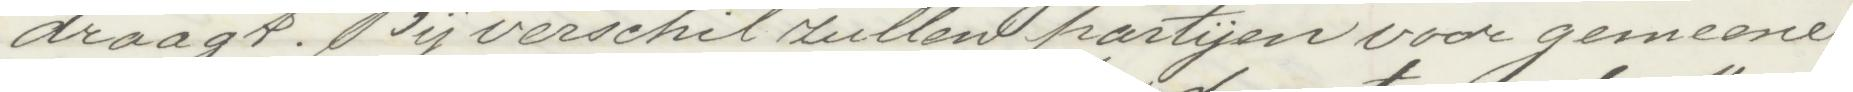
draagt. Bij verschil zullen partijen voor gemeene
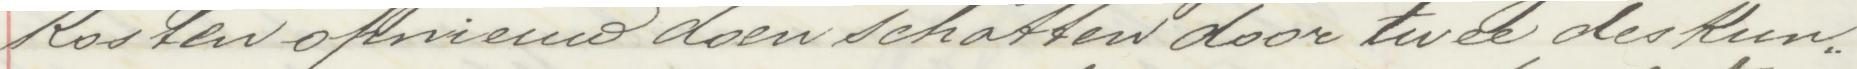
kosten opnieuw doen schatten door twee deskun„
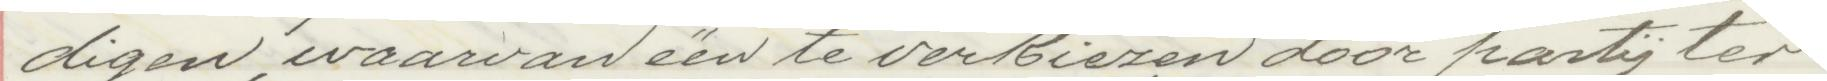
digen, waarvan één te verkiezen door partij ter
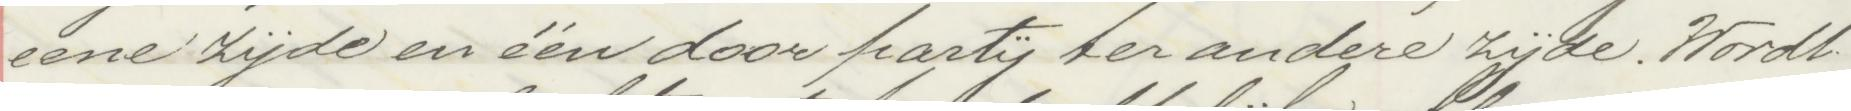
eene zijde en één door partij ter andere zijde. Wordt
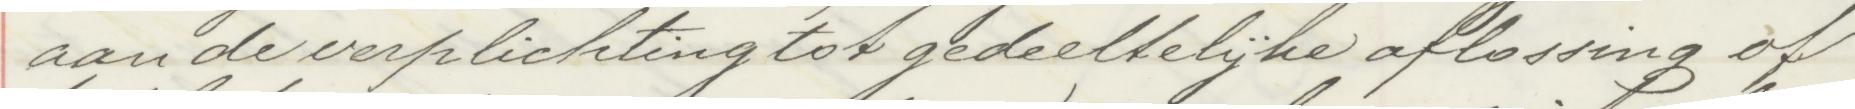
aan de verplichting tot gedeeltelijke aflossing of
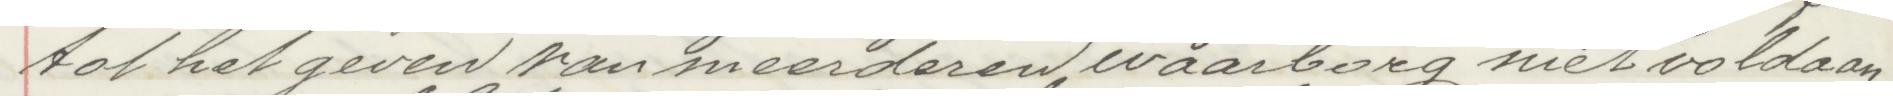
tot het geven van meerderen waarborg niet voldaan,
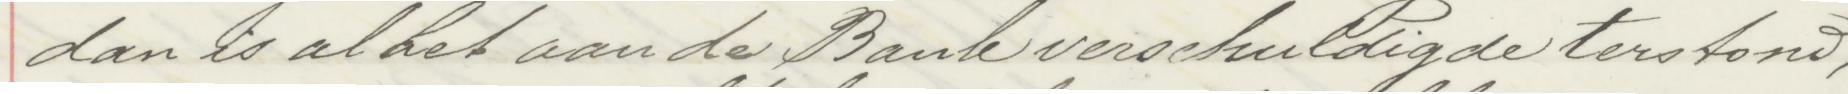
dan is al het aan de Bank verschuldigde terstond,
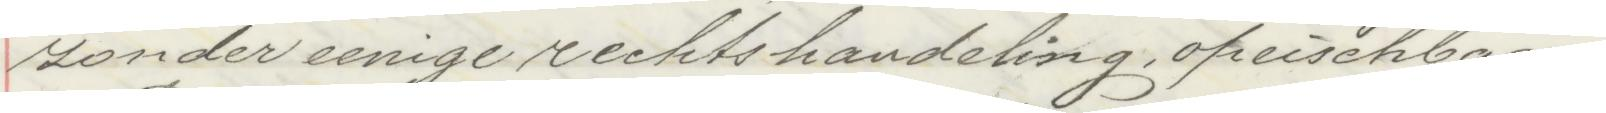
zonder eenige rechtshandeling, opeischbaar.
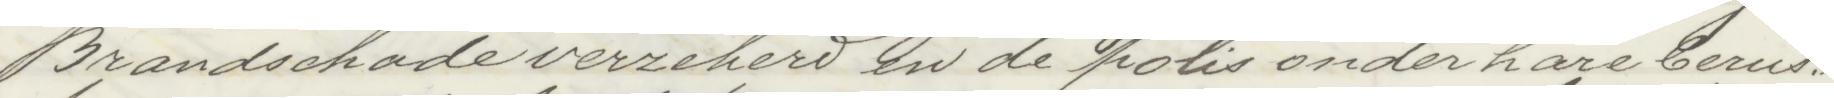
Brandschade verzekerd en de polis onder hare berus„
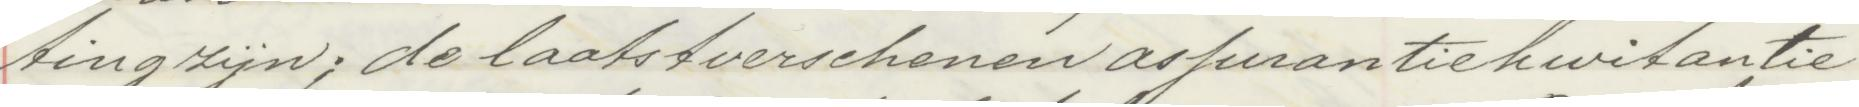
ting zijn, de laatstverschenen assurantie kwitantie
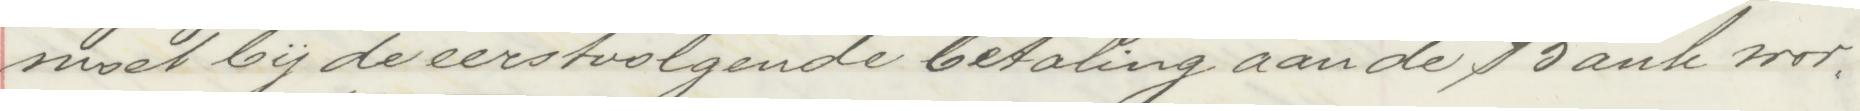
moet bij de eerstvolgende betaling aan de Bank wor„
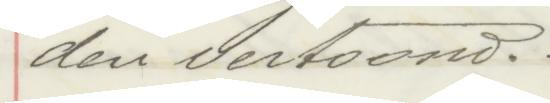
den vertoond.
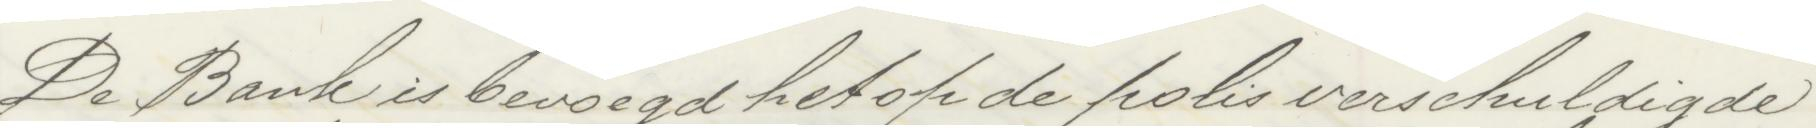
De Bank is bevoegd het op de polis verschuldigde
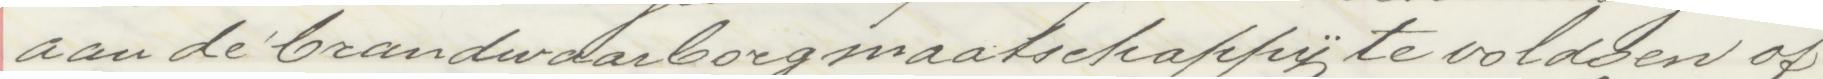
aan de brandwaarborg maatschappij te voldoen of
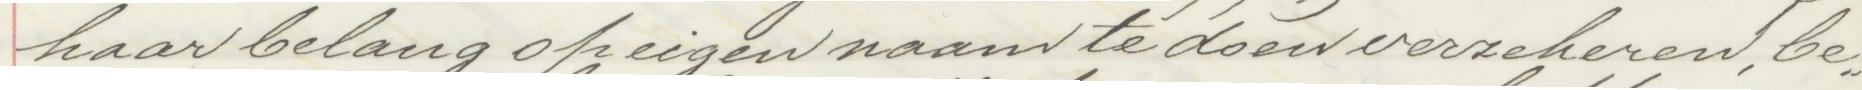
haar belang op eigen naam te doen verzekeren, be„
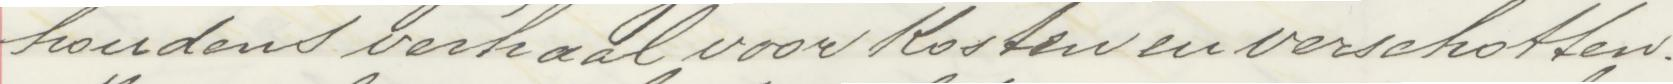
houdens verhaal voor kosten en verschotten.
